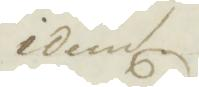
idem . . . . . . . . . . . .
